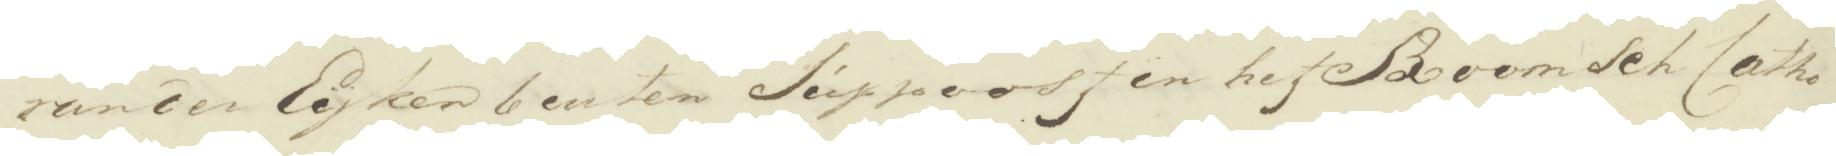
van der Eijken buiten Suppoost in het Roomsch Catho
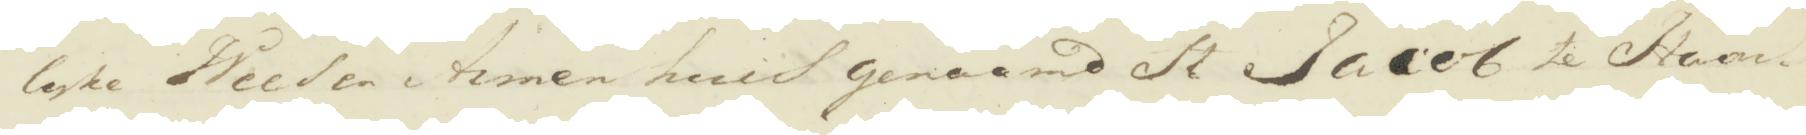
lyke Wees en Armen huis genaamd St Jacob te Haar„
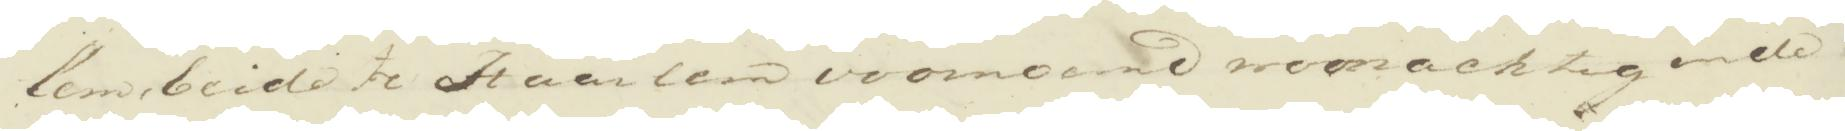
lem, beide te Haarlem voornoemd woonachtig in de
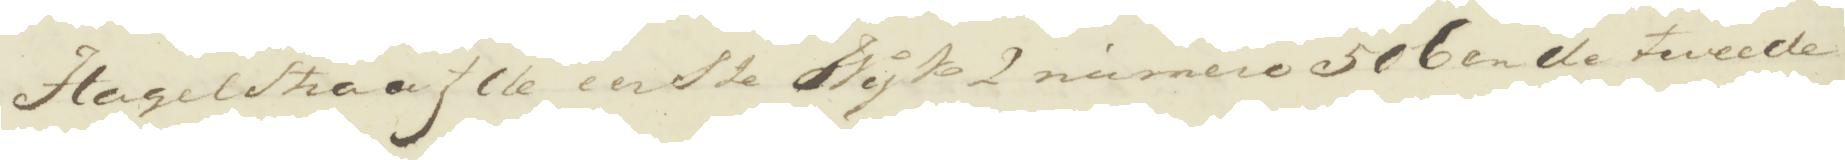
Hagelstraat de eerste Wyk 2 numero 506 en de tweede
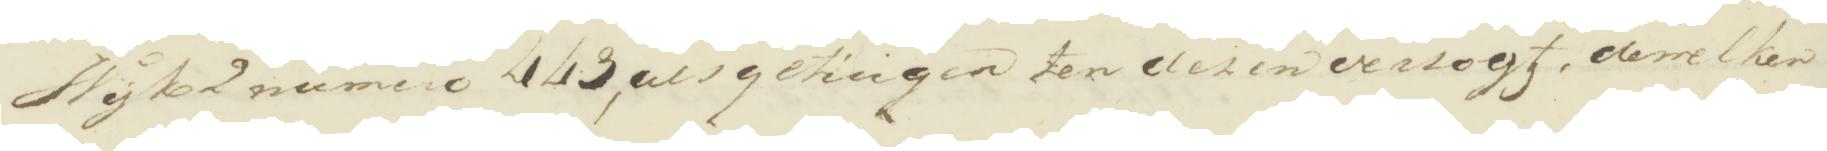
wijk 2 numero 443, als getuigen ten dezen verzogt, de welken
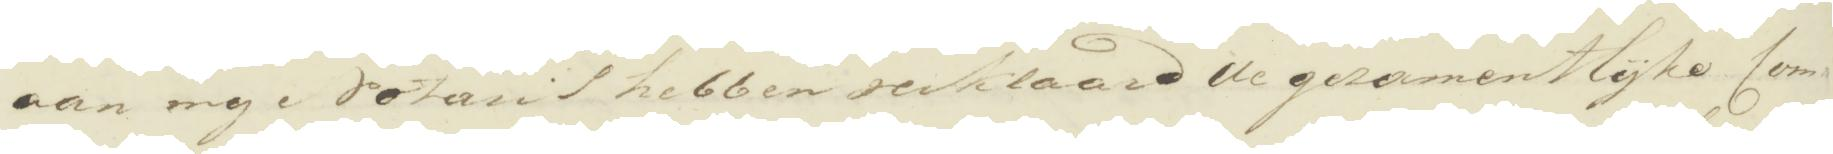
aan my Notaris hebben verklaard de gezamentlijke Com„
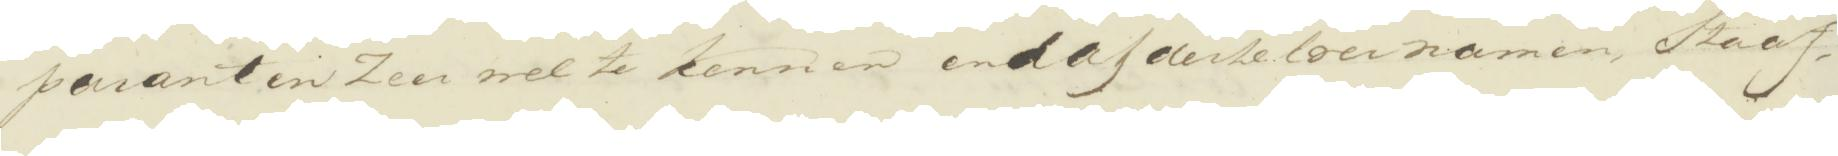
paranten Zeer wel te kennen en dat dezelver namen, staat,
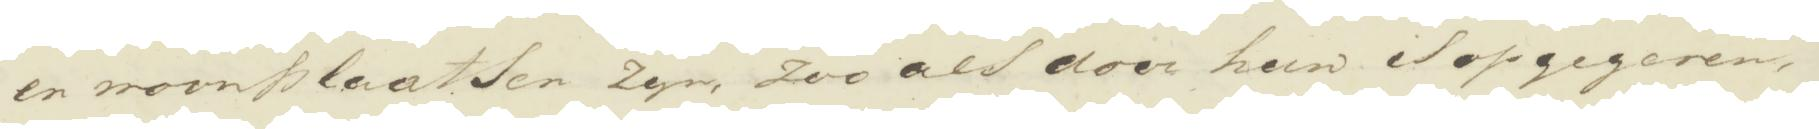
en woonplaatsen zyn, zoo als door hun is opgegeven,
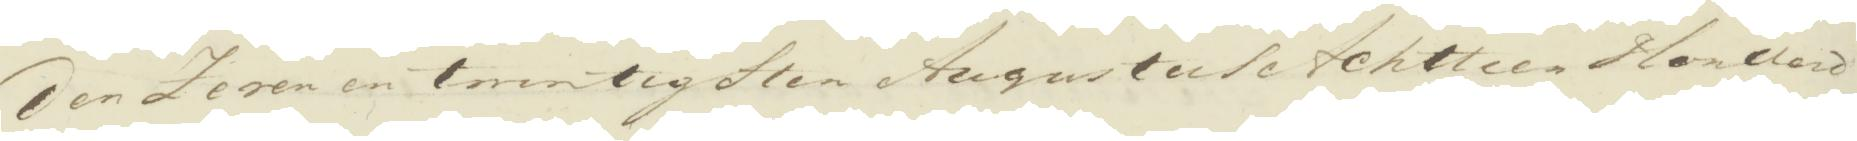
den Zeven en twintigsten Augustus Achttien Honderd
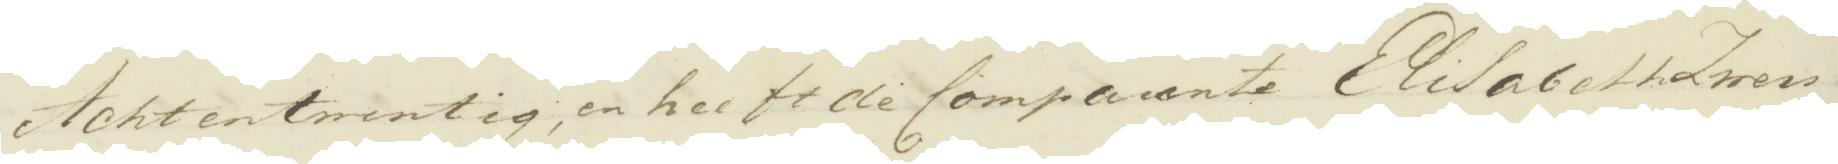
Acht en twintig, en heeft de Comparante Elisabeth Zwers
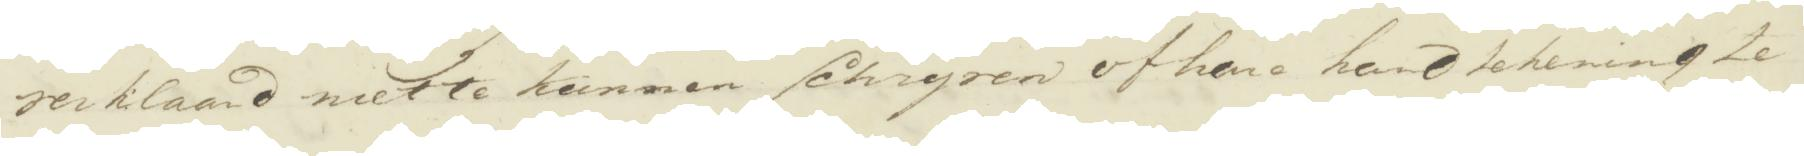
verklaard niet te kunnen schryven of hare handtekening te
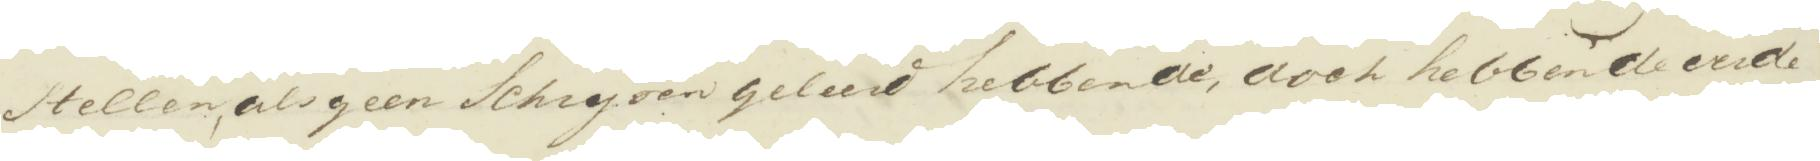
stellen, als geen Schryven geleerd hebbende, doch hebben de verde
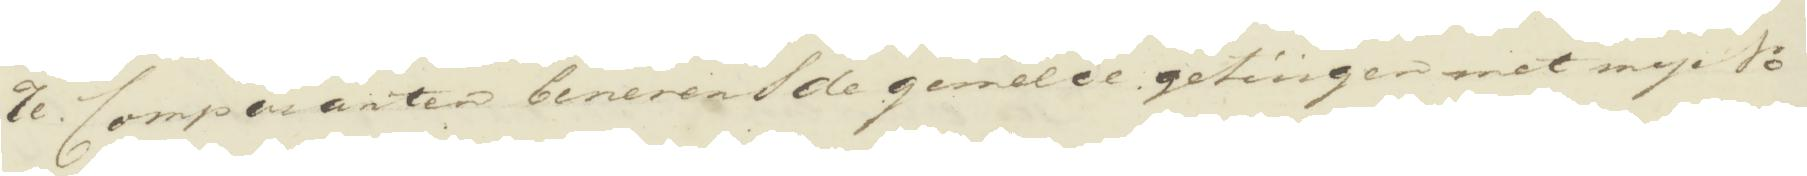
re Comparanten benevens de gemelde getuigen met my No
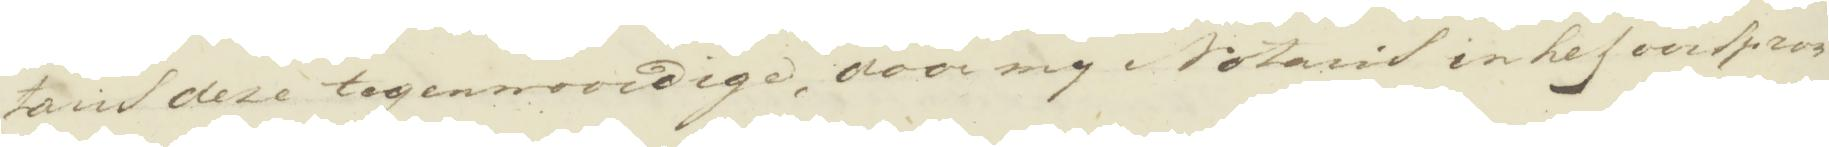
taris deze tegenwoordige, door my Notaris in het oorspron
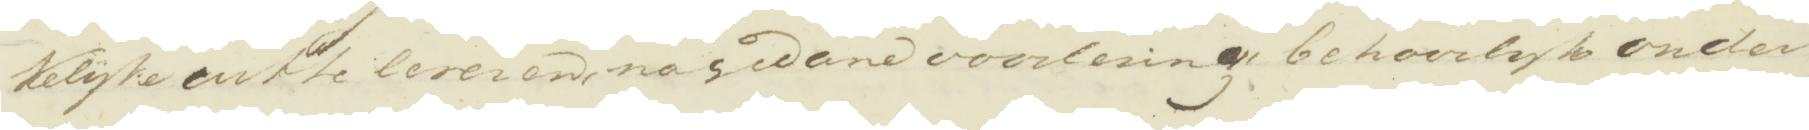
kelijke uit te leveren, na gedane voorlezing behoorlyk onder
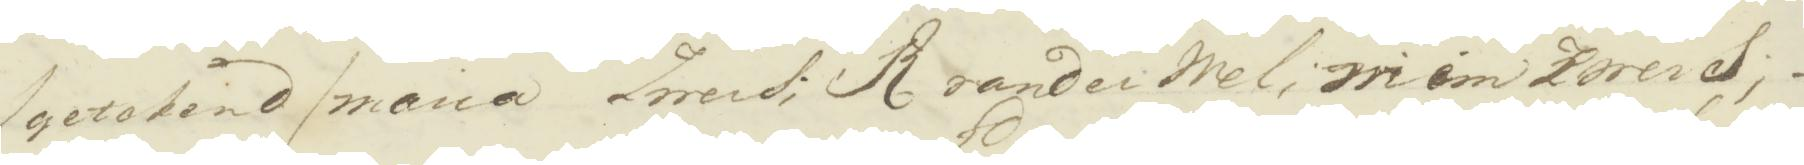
/getekend /maria Zwers, R van der Wel, wi em Zwers;
